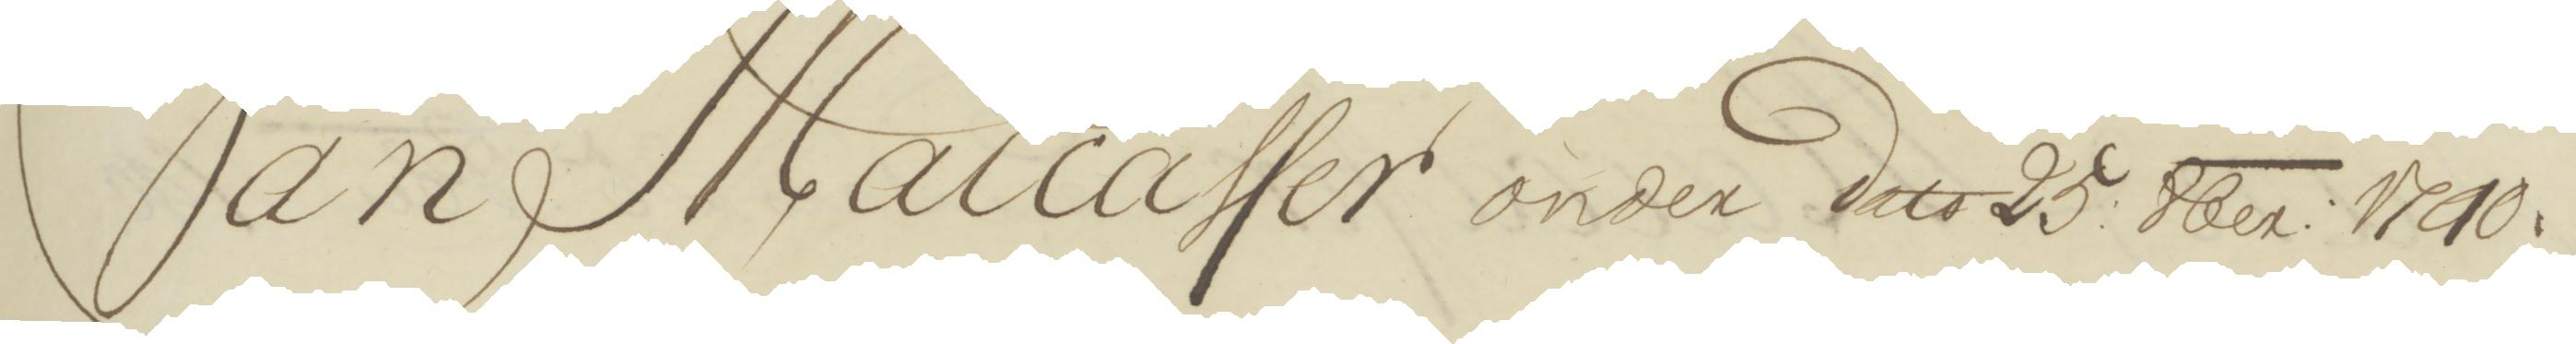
Van Maccasser onder dato 25: 8ber: 1740:
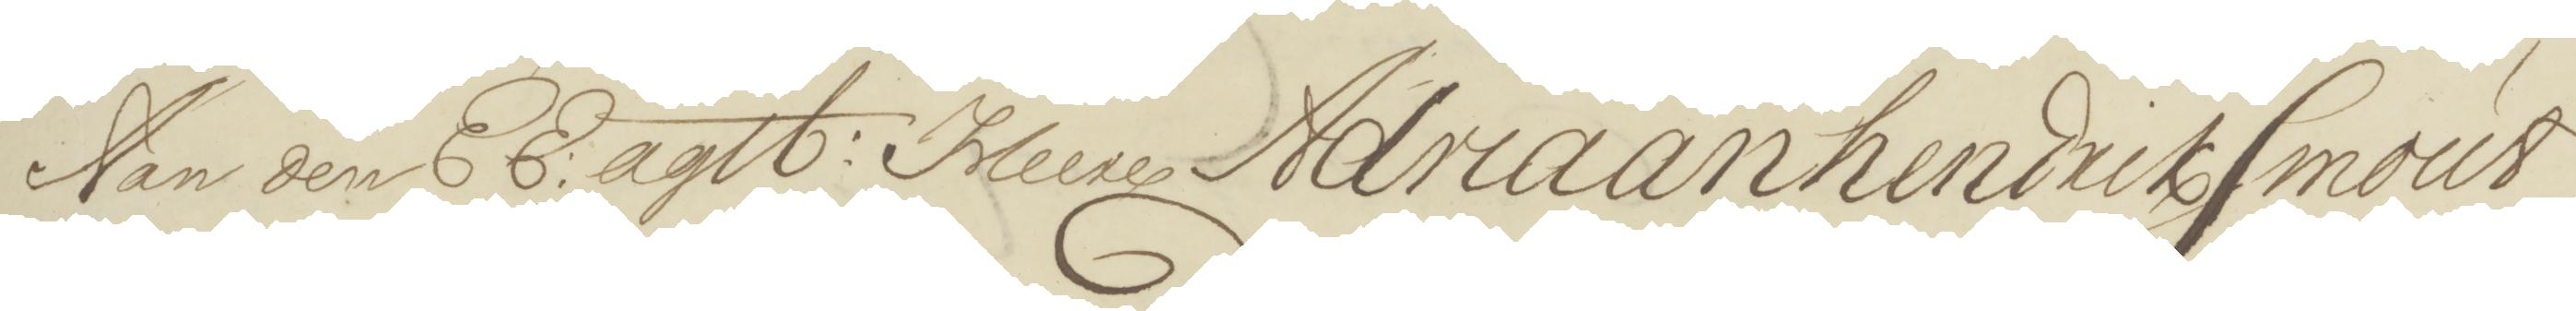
Aan den E E: agtb: Heere Adriaan hendrik Smout
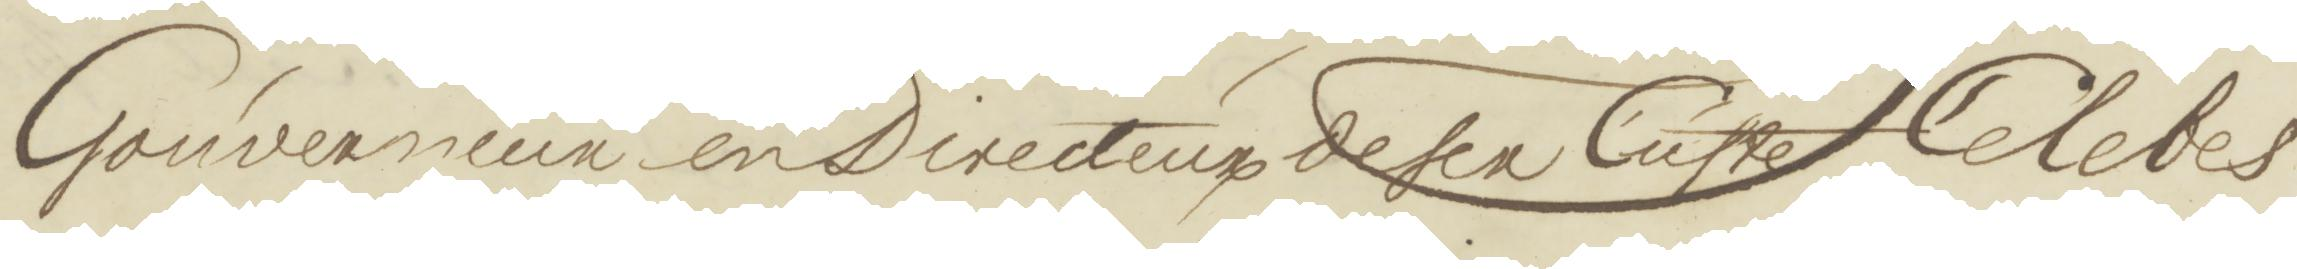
Gouverneur en Directeur deser Custe Celebes
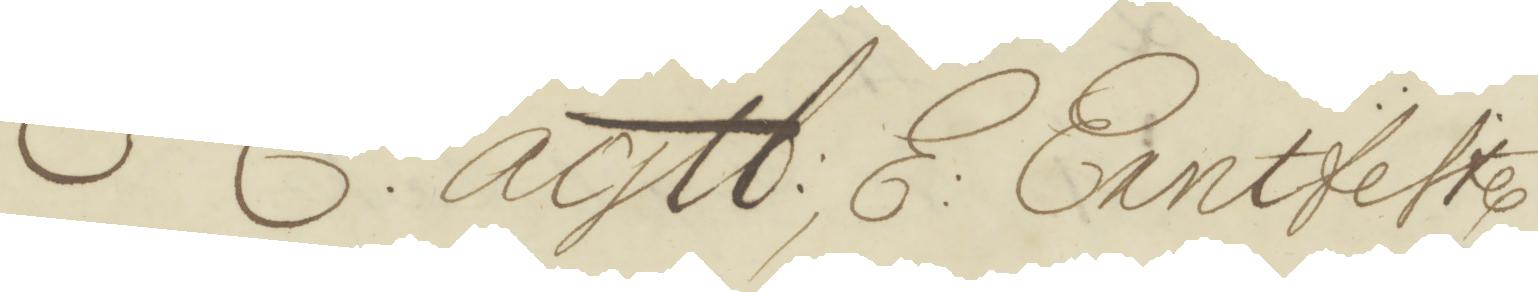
E E: agtb: E: Erntfeste
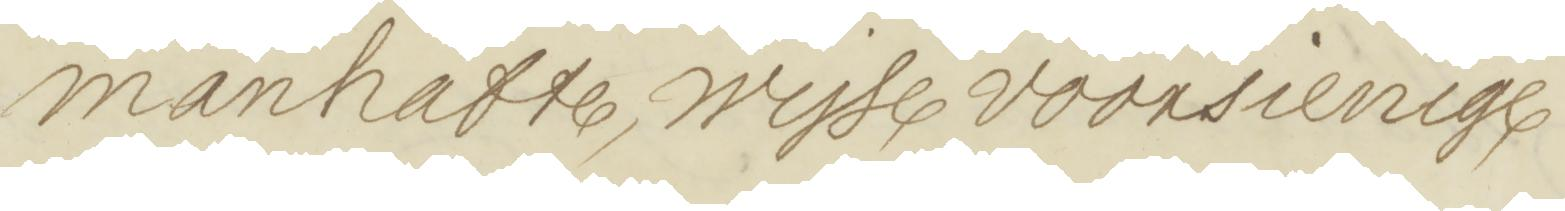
manhafte, wijse voorsienige
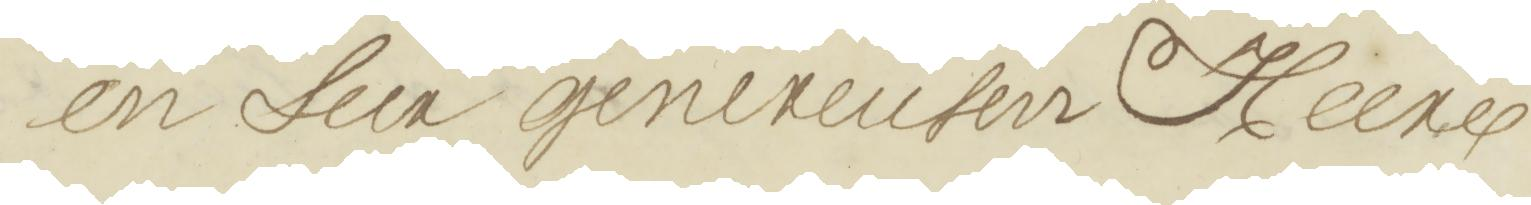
en seer genereusen Heere
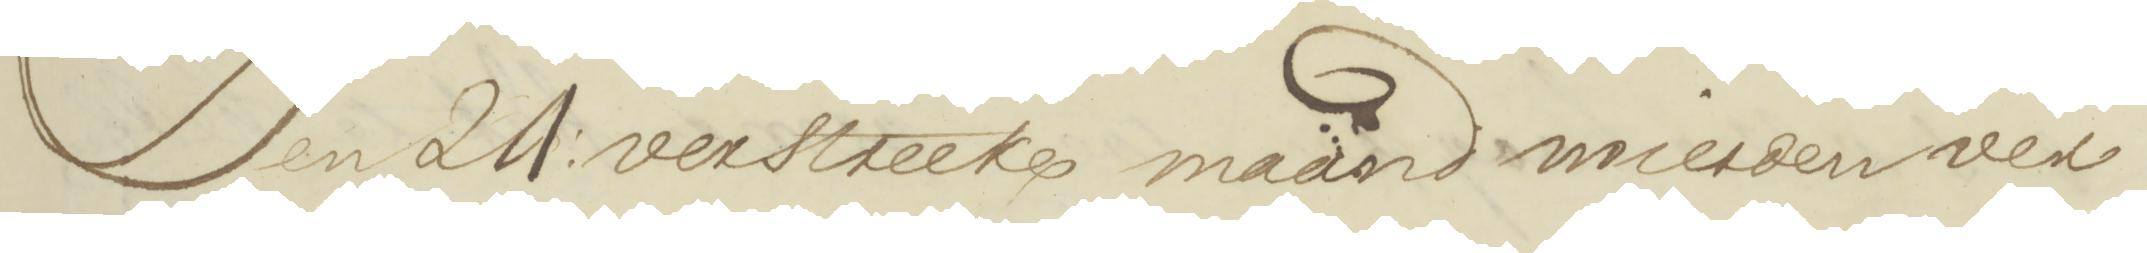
Den 24: verstreeke maand wierden ver
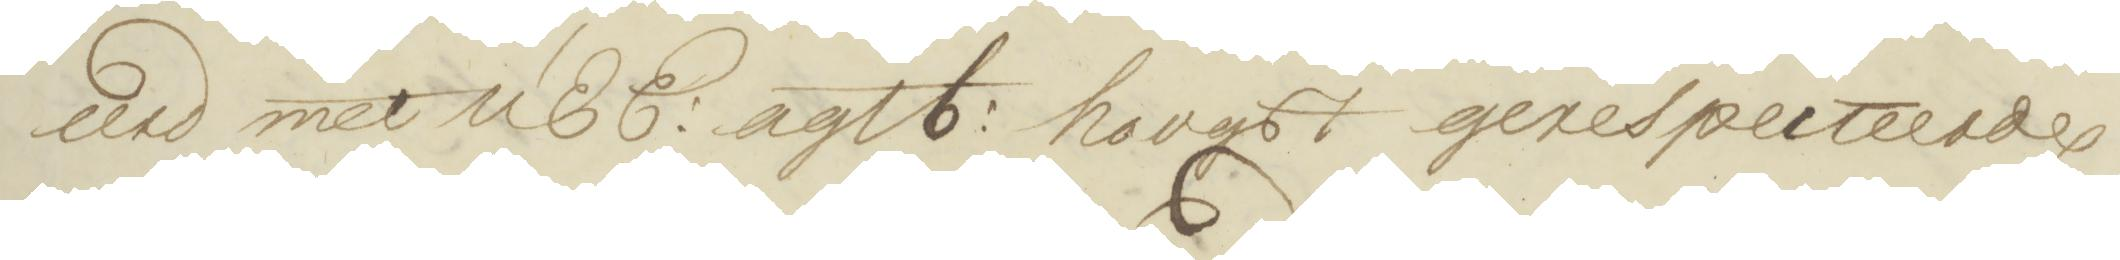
eerd met uE E: agtb: hoogst gerespecteerde
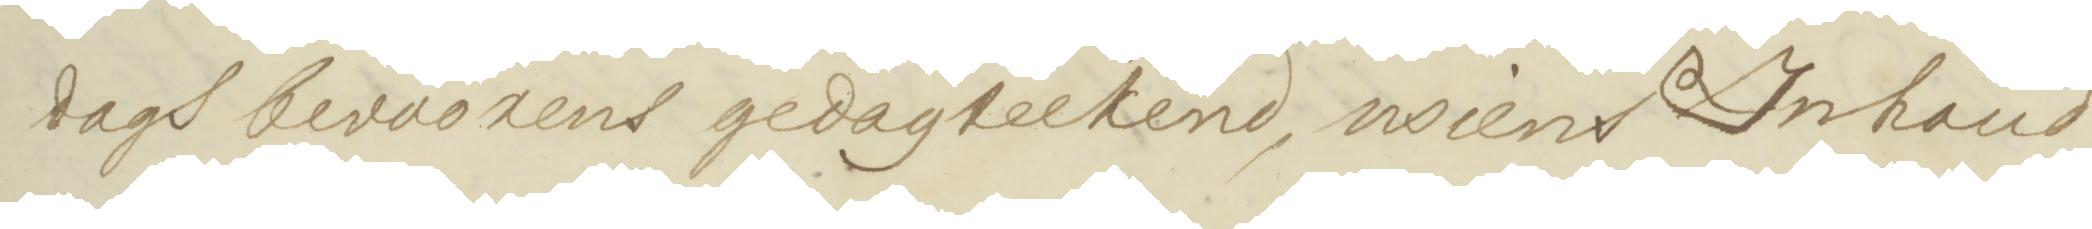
dags bevoorens gedagteekend, wiens Inhoud
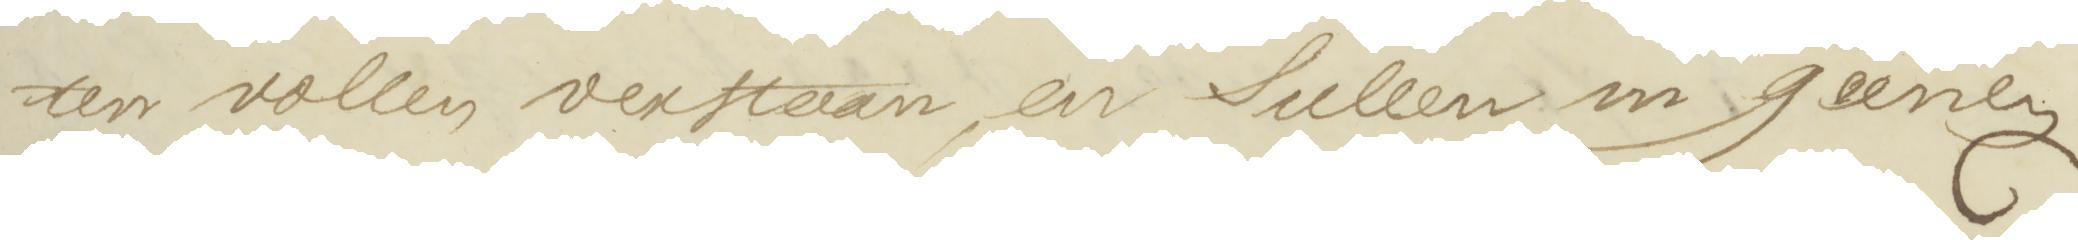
ten vollen verstaan, en sullen in geenen
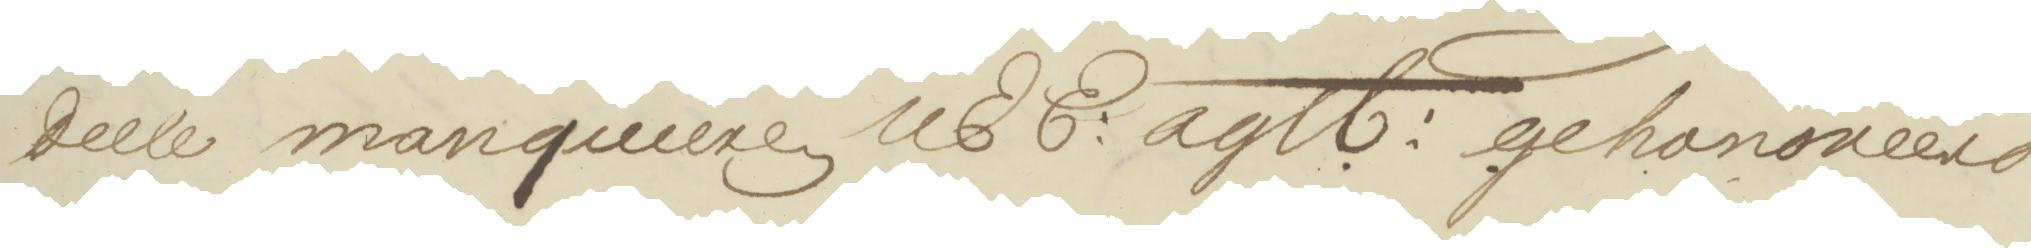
deele manqueeren UE E: agtb: gehonoreerd
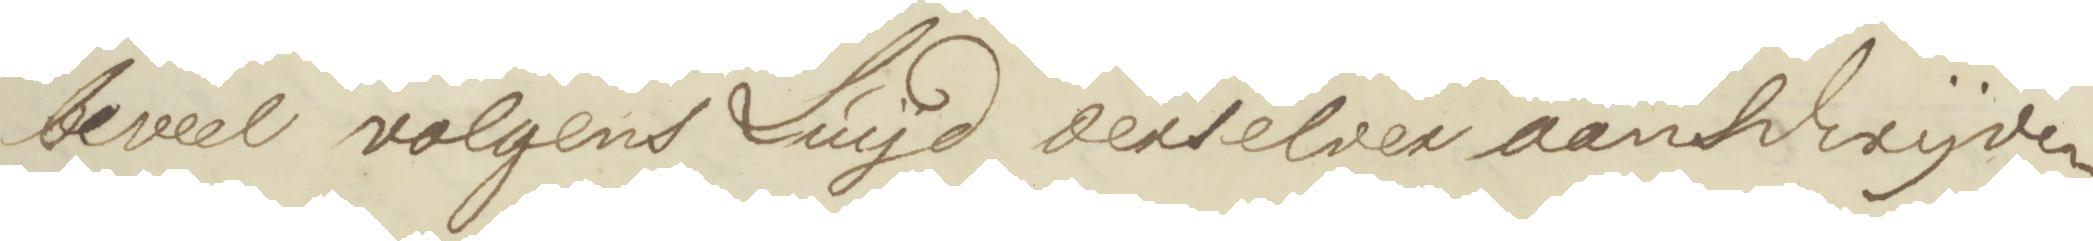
beveel volgens Luijd derselver aanschrijven
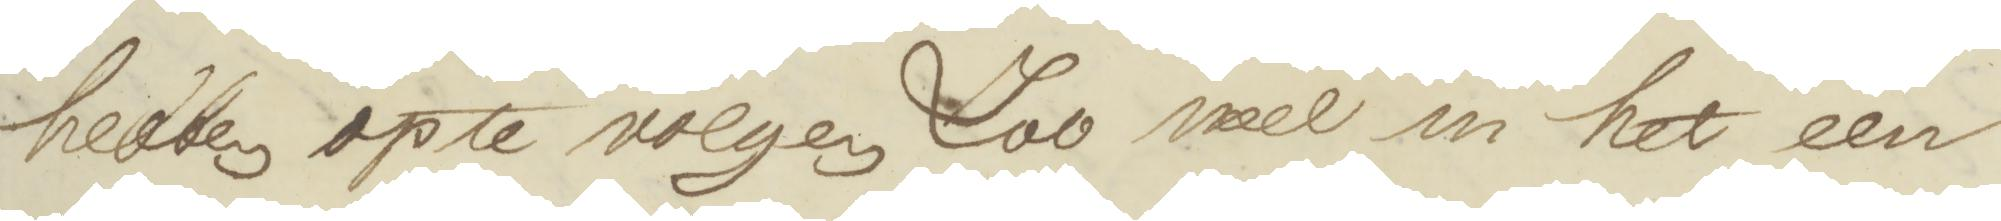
hebben op te volgen zoo wel in het een
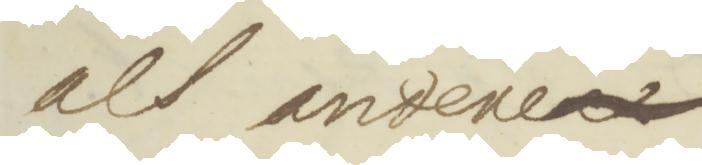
als andere
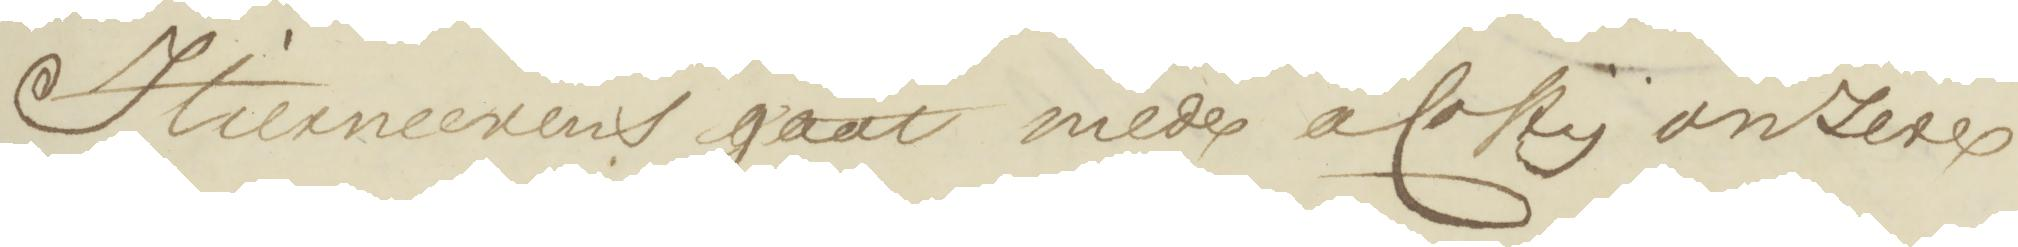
Itierneerens gaa't mede acostij onzere
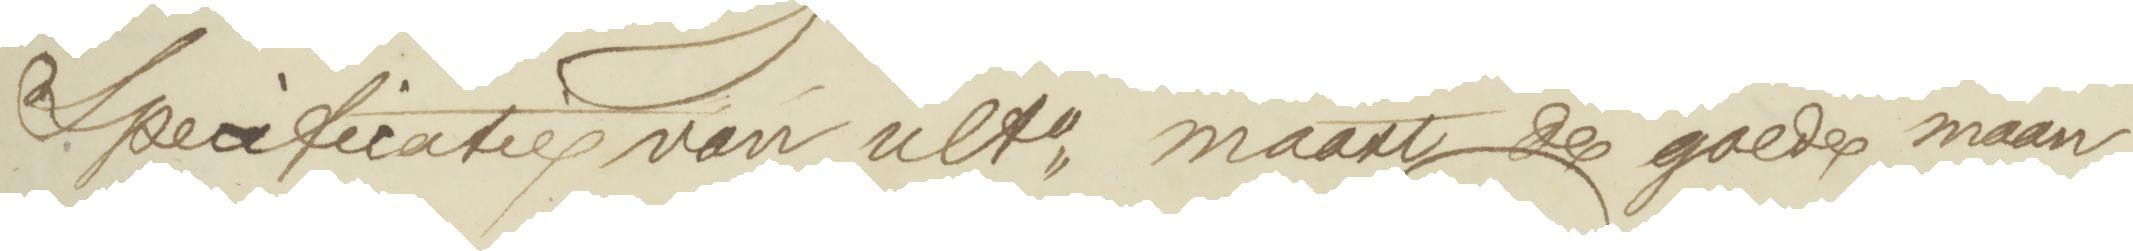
specificatie van ult„o maart de goede maan;
